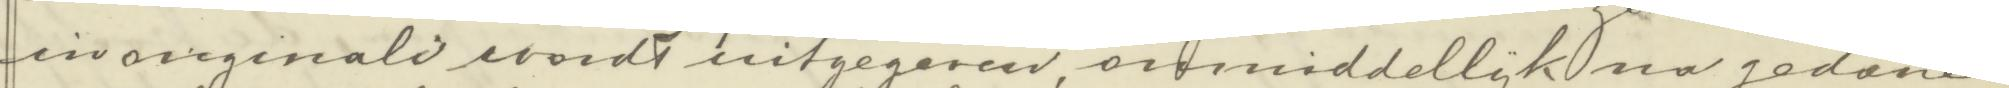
in originali wordt uitgegeven, onmiddellijk na gedane
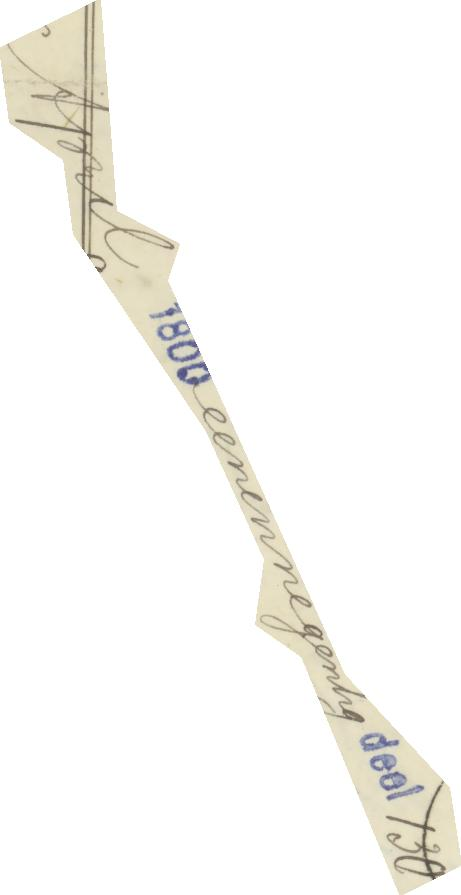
April 1800 eenennegentig deel 130
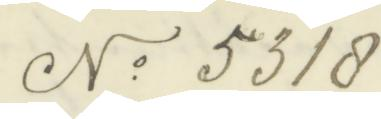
N.o 5318
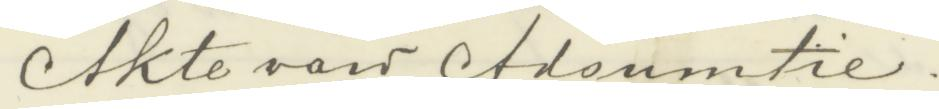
Akte van Adsumtie.
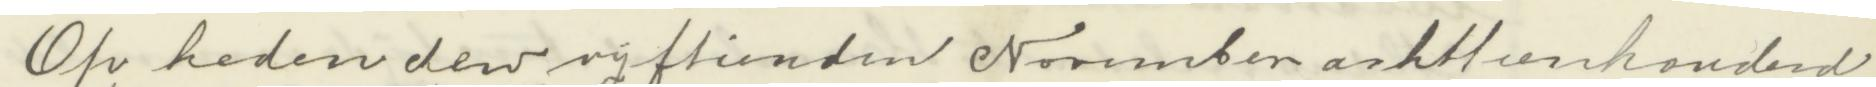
Op heden den vijftienden November achttienhonderd
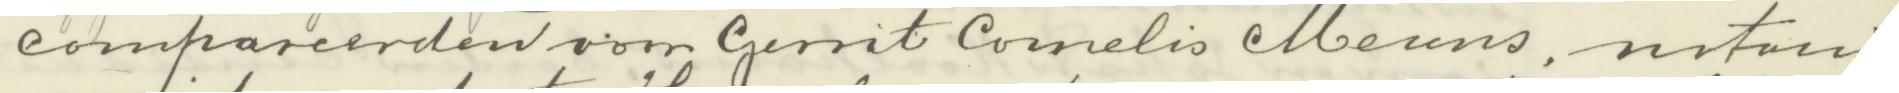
compareerden voor Gerrit Cornelis Merens, notaris
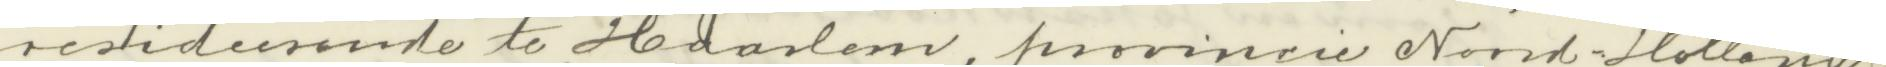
resideerende te Haarlem, provincie Noord-Holland
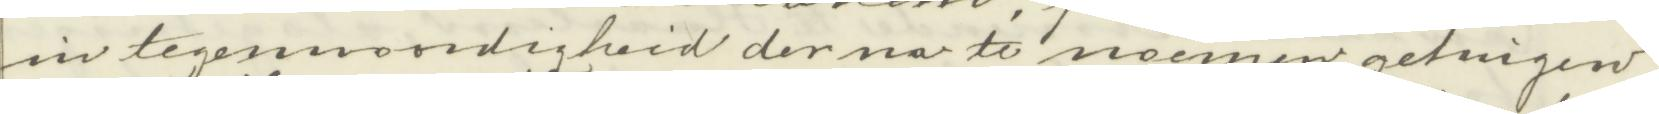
in tegenwoordigheid der na te noemen getuigen
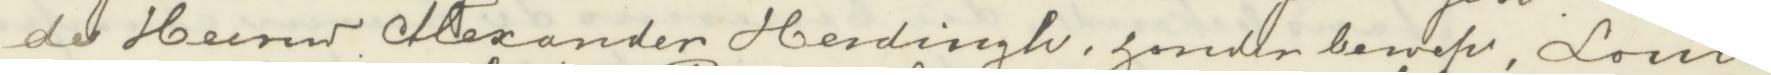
de Heeren Aexander Herdingh, zonder beroep, Louis
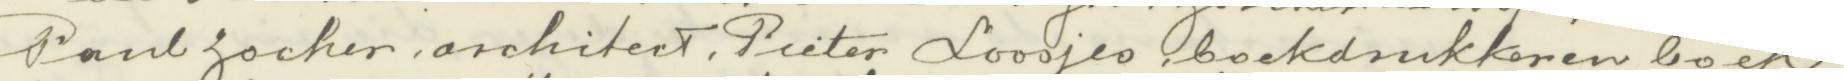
Paul zocher, architect, Pieter Loosjes, boekdrukker en boek
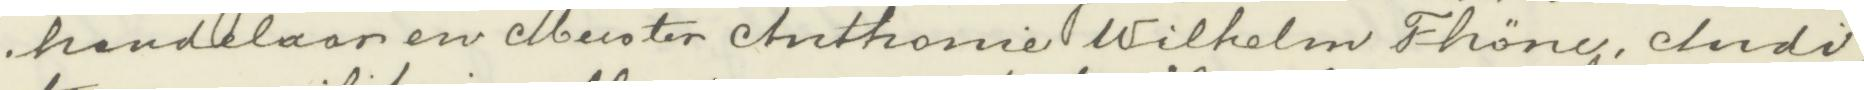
handelaar en Meester Anthonie Wilhelm Thöne, Audi
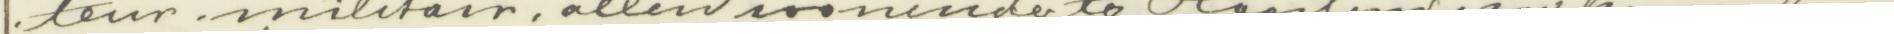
teur-militair, allen wonende te Haarlem, in hunne hoe
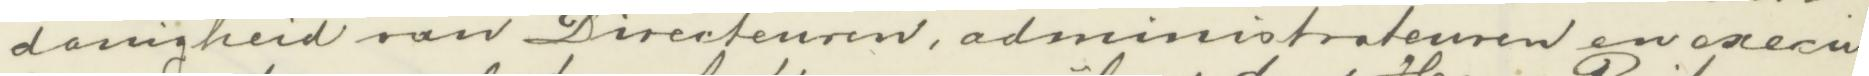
danigheid van Directeuren, administrateuren en execu
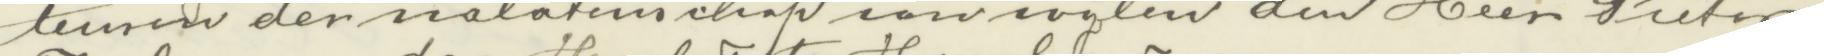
teuren der nalatenschap van wijlen den Heer Pieter
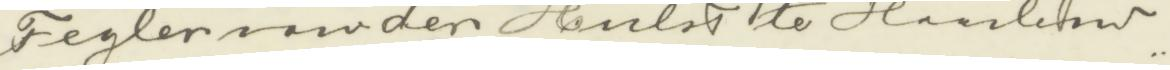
Teyler van der Hulst te Haarlem
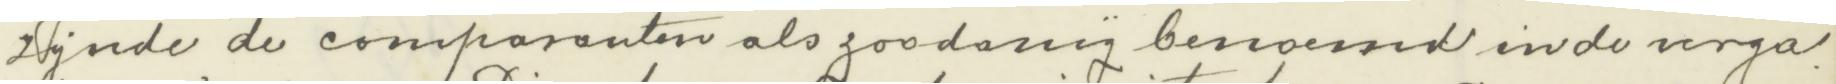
Zijnde de comparanten als zoodanig benoemd in de verga.
